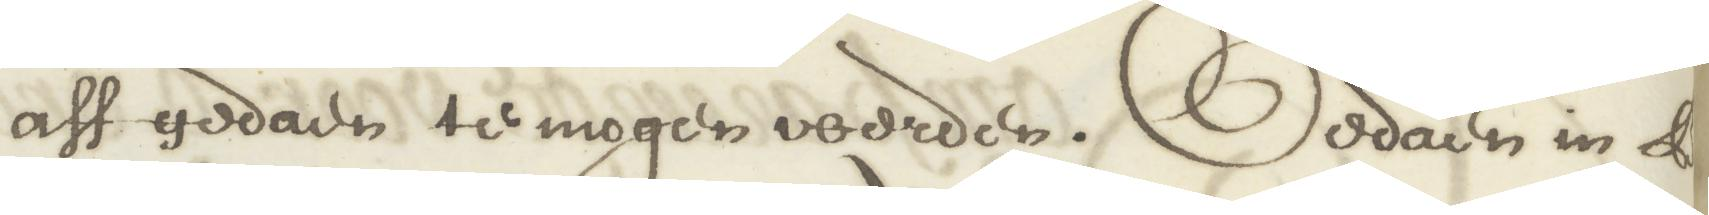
aff gedaen te mogen werden. Gedaen in
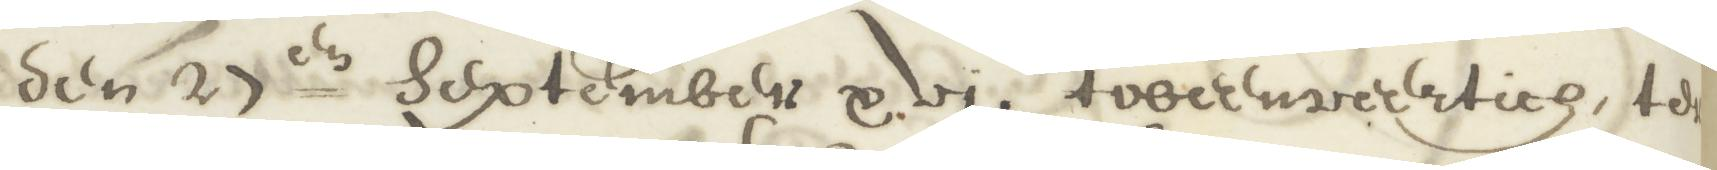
den 27=en September xvij.e tweenveertich, ter ==p: di. tebeenveertich, ter
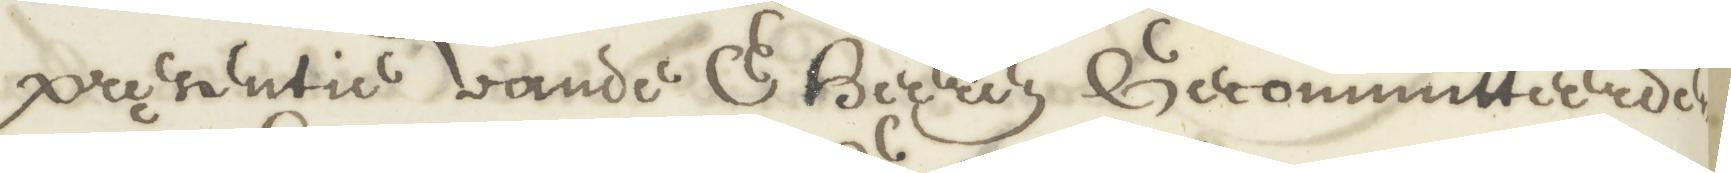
presentie vande E heeren Gecommitteerde
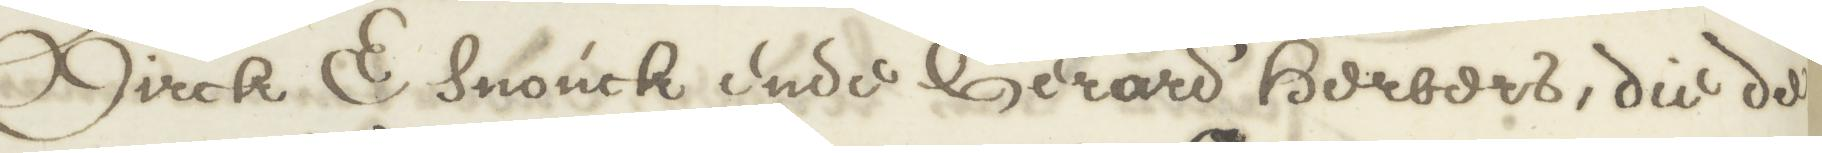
Dirck E snouck ende Gerard herbers, die de
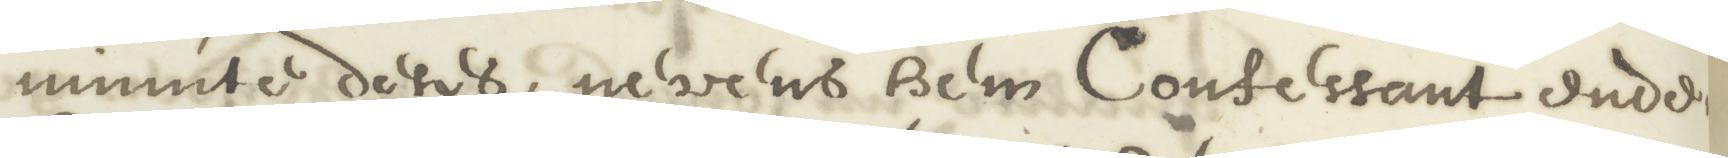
minute deses, nevens hem Confessant ende
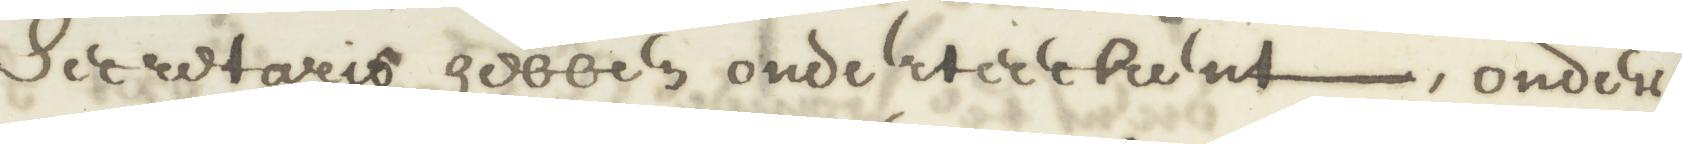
Secretaris hebben onderteeckent, onder
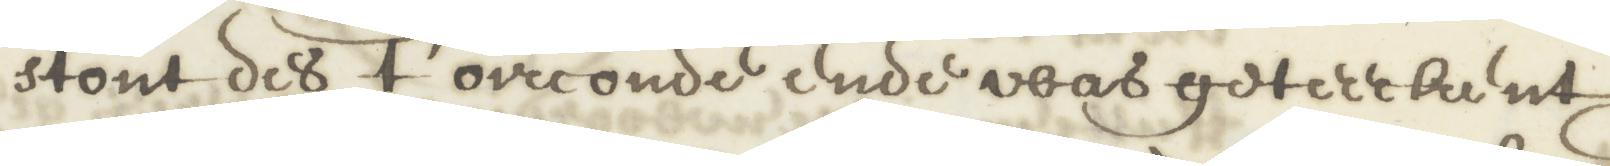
stont des t' oirconde ende was geteeckent
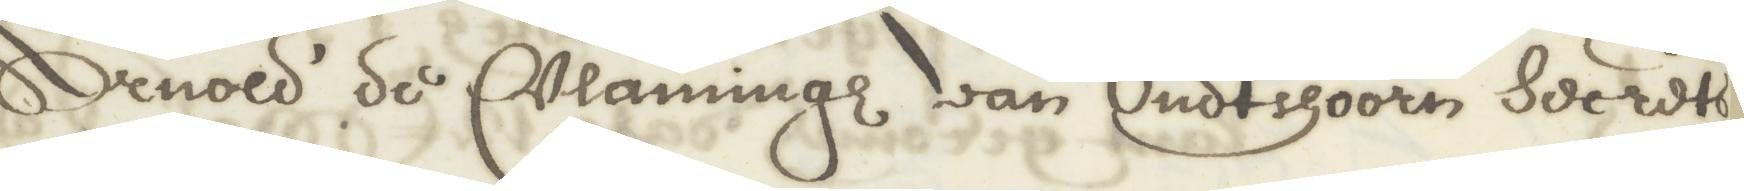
Arnold de Vlamingh van Oudtshoorn secrets
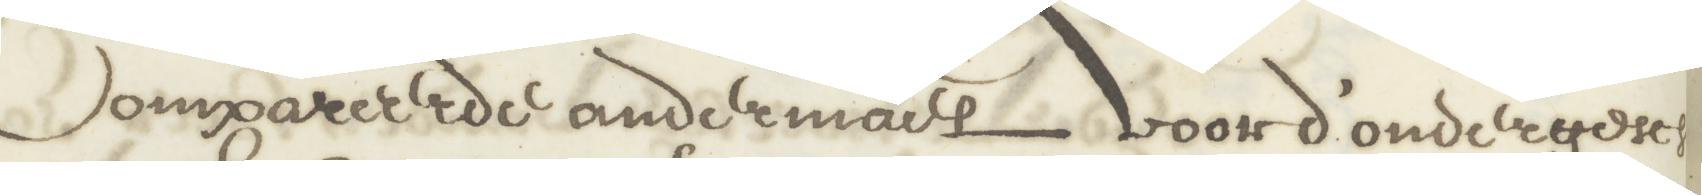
Compareerde andermael voor d’ ondergesch
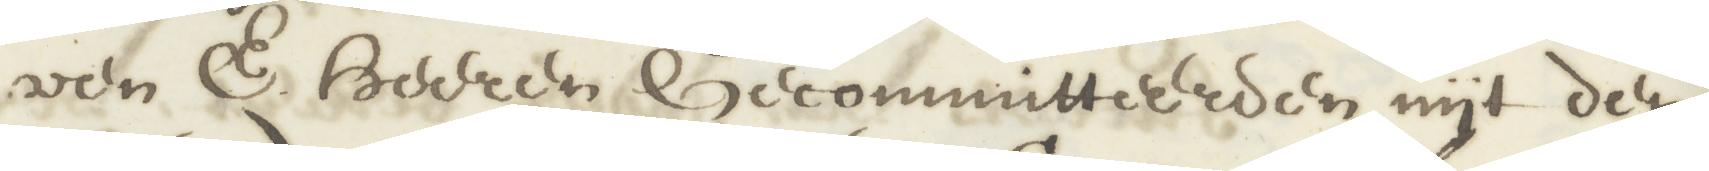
ven E. Heeren Gecommitteerden uijt den
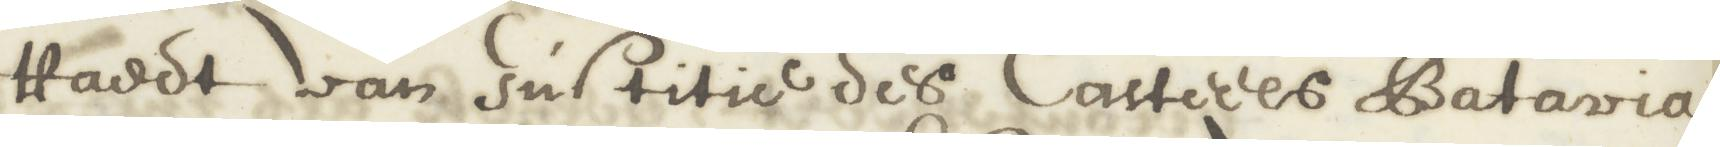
Raedt van Iustitie des Casteels Batavia
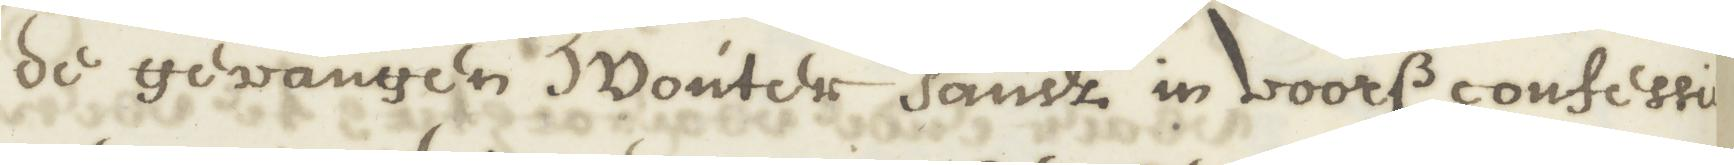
de gevangen Wouter Iansz in voorsz confessi
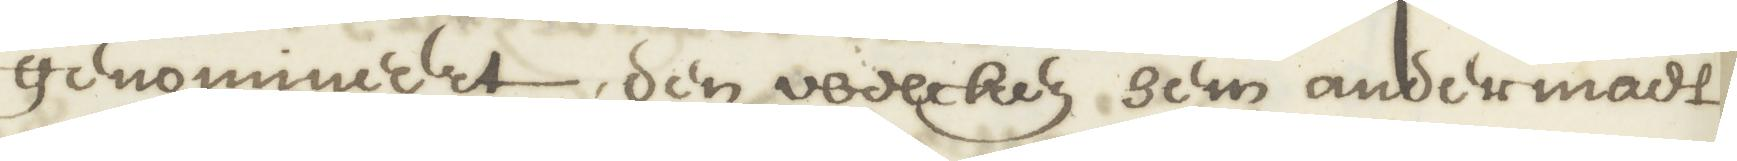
genommeert, den welcken hem andermael
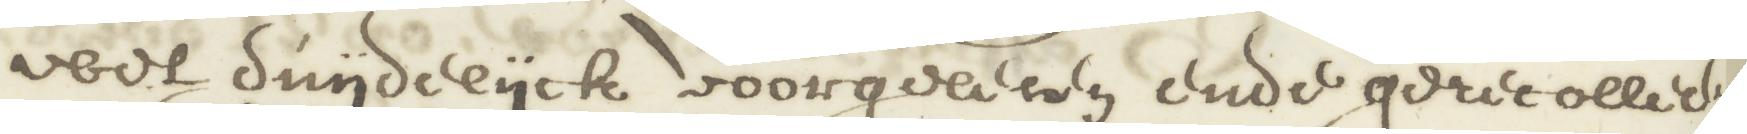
wel duijdelijck voorgelesen ende gerecolleer
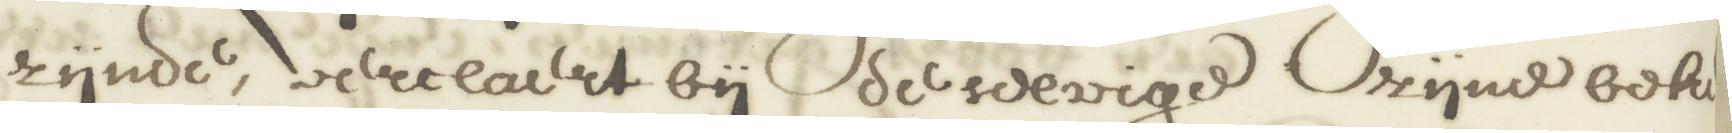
zijnde, verclaert bij de selvige zijne bek
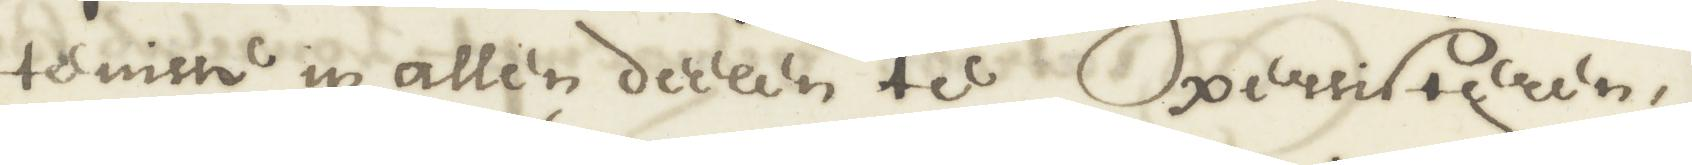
tenisse in allen deelen te persisteren,
